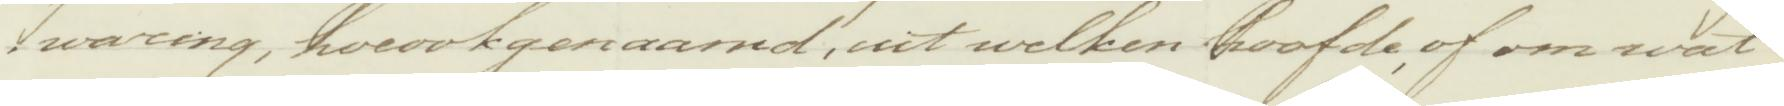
„waring, hoe ook genaamd, uit welken hoofde, of om wat
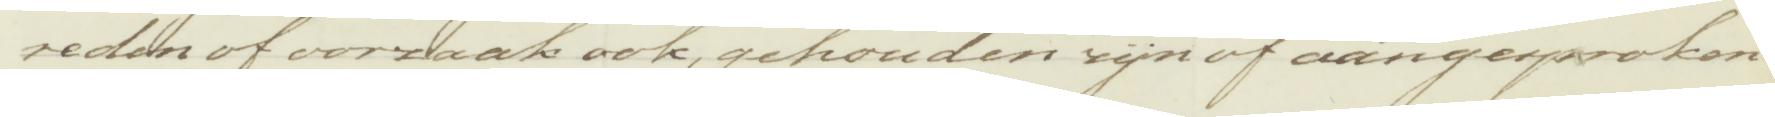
reden of oorzaak ook, gehouden zijn of aangesproken
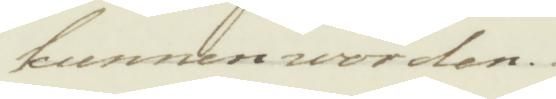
kunnen worden.
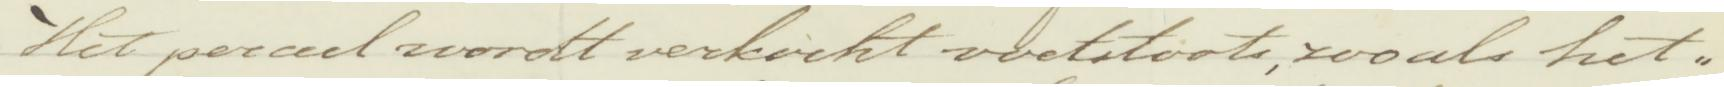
Het perceel wordt verkocht voetstoots, zoo als het„
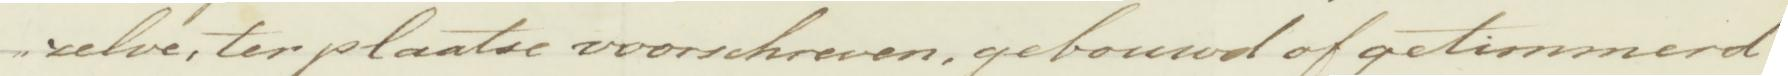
„zelve, ter plaatse voorschreven, gebouwd of getimmerd
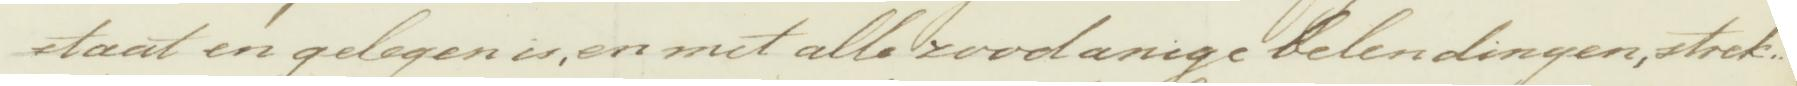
staat en gelegen is, en met alle zoodanige belendingen, strek„
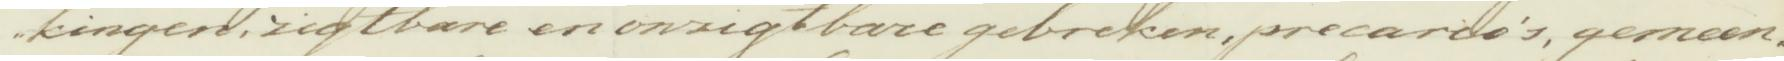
„kingen, zigtbare en onzigtbare gebreken, precario's, gemeen
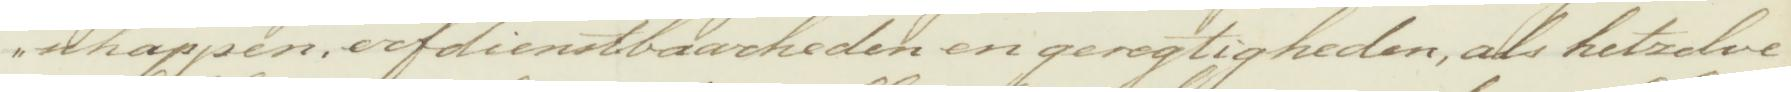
„schappen, erfdienstbaarheden en geregtigheden, als hetzelve
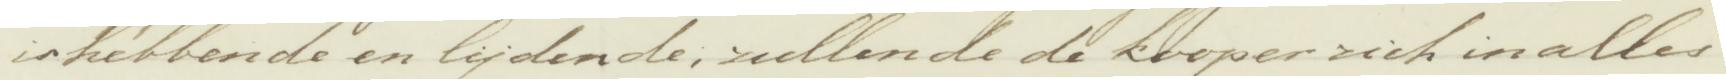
is hebbende en lijdende, zullende de kooper zich in alles
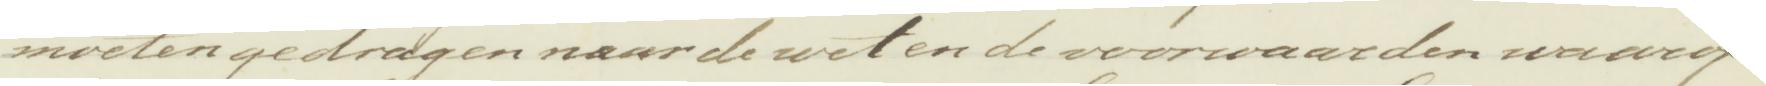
moeten gedragen naar de wet en de voorwaarden waarop
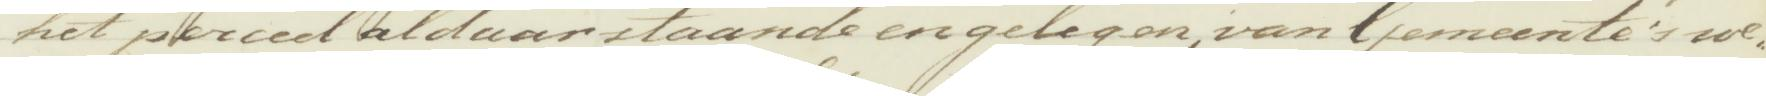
het perceel aldaar staande en gelegen, van Gemeente's we
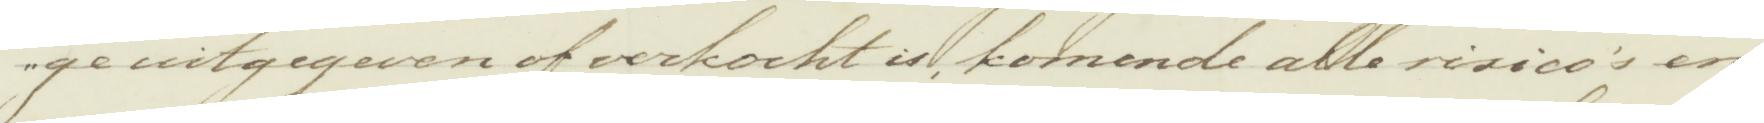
„ge uitgegeven of verkocht is, komende alle risico's en
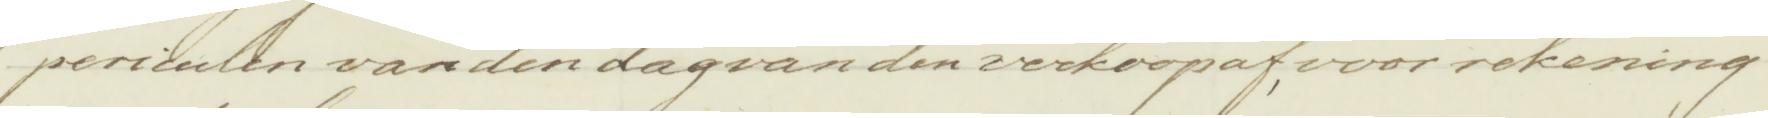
periculen van den dag van den verkoop af voor rekening
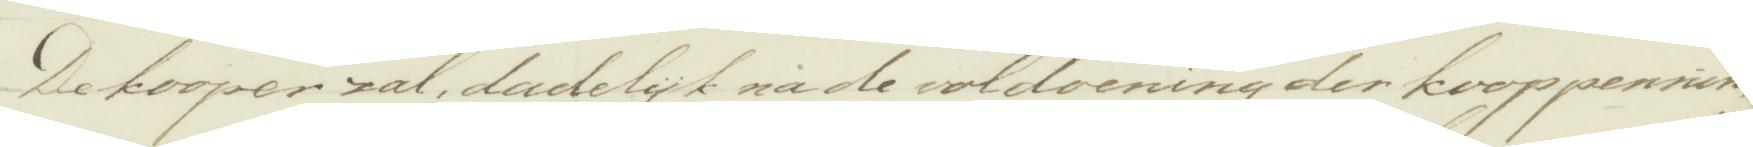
De kooper zal, dadelijk na de voldoening der kooppennin
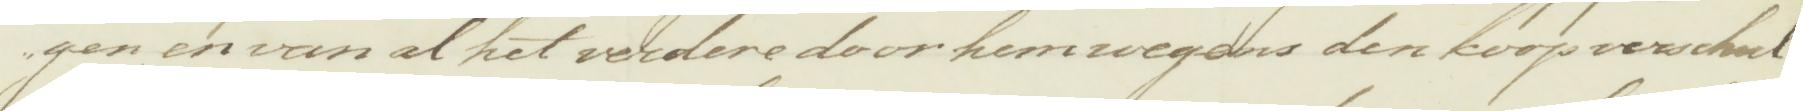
„gen en van al het verdere door hem wegens den koop verschul
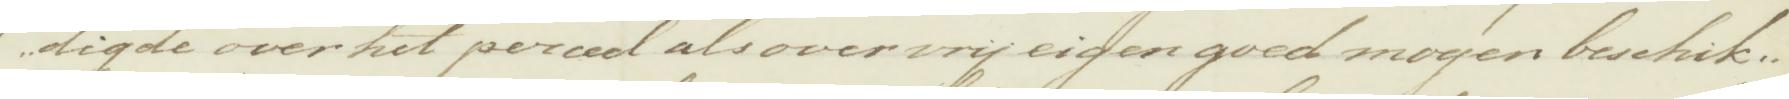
„digde over het perceel als over vrij eigen goed mogen beschik„
